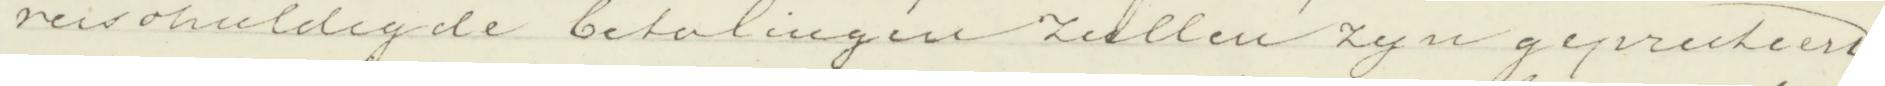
verschuldigde betalingen zullen zyn gepresteerd
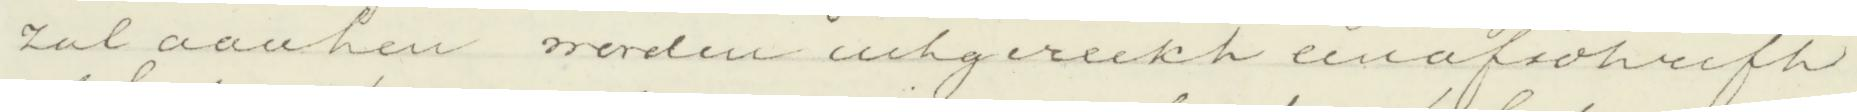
zal aanhen worden uitgereikt eenafschritt
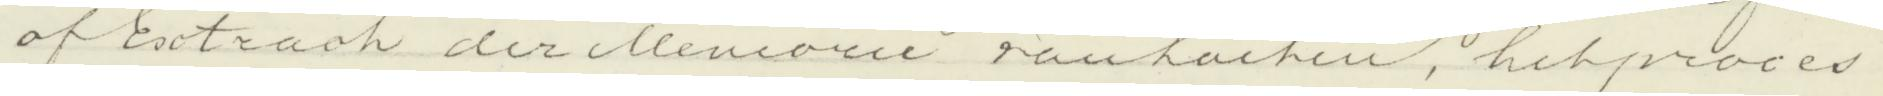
ofExtract der Memorie vanlasten, hetproces
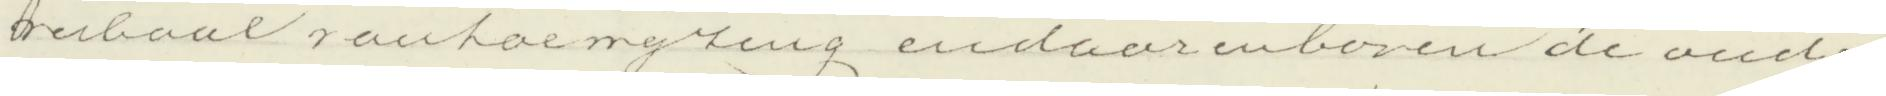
verbaal vantoewyzing endaar enboven de oude
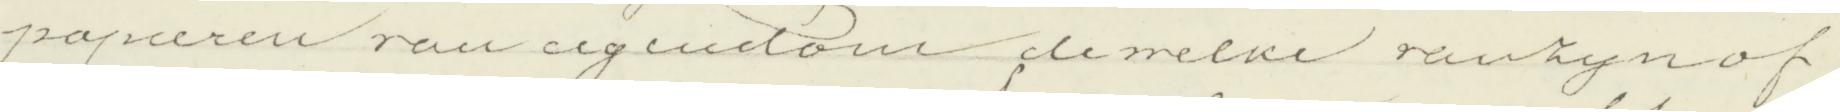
papieren van eigendom de welke vanzyn of
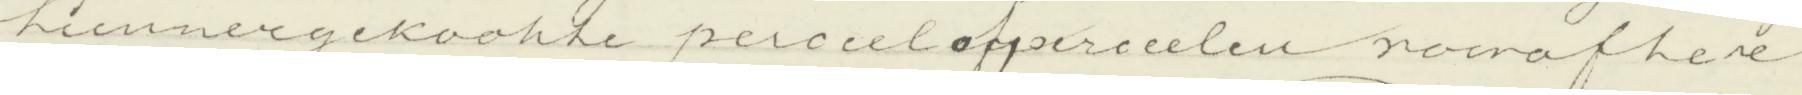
hunnergekochte perceel of perceelen voorafter
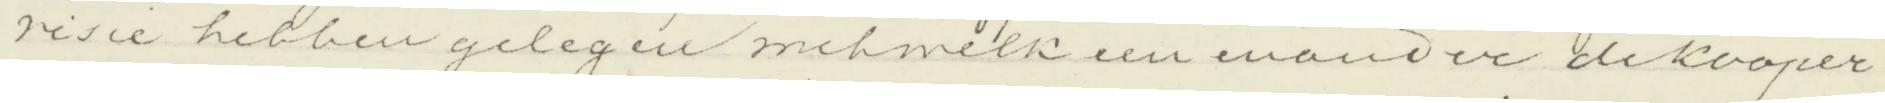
visie hebben gelegen metwelk een enander dekooper
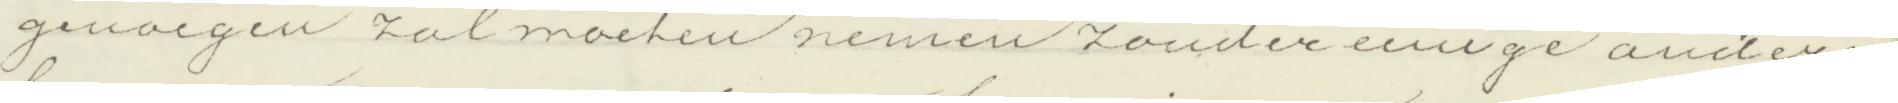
genoegen zal moeten nemen zonder eenige andere
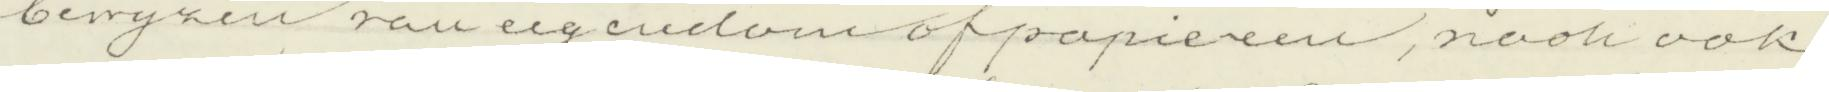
bewyzen van eigendom ofpapieren, noch ook
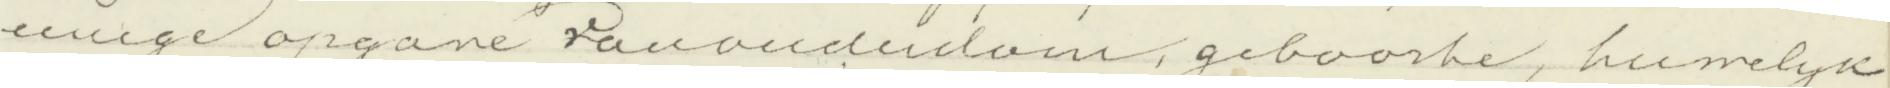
eenige opgave vanouderdom, geboorte, huwelyk
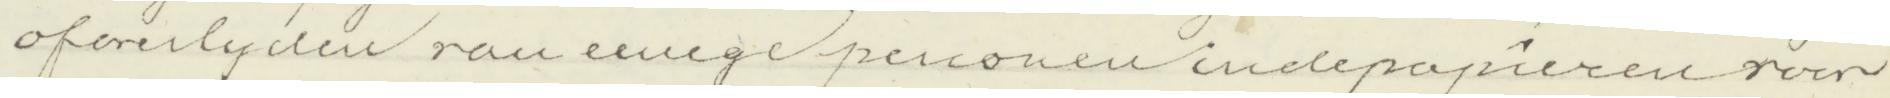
of overlyden van eenige penonen indepapieren voor
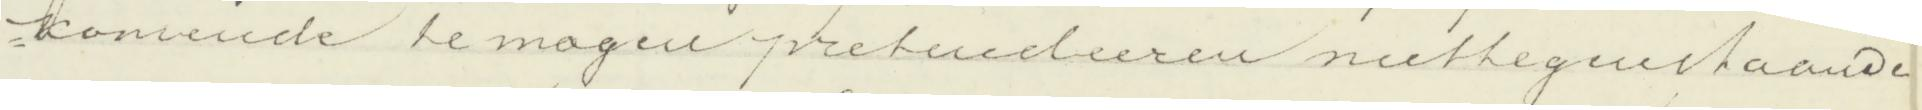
komende te mogen pretendeeren niettegenstaande
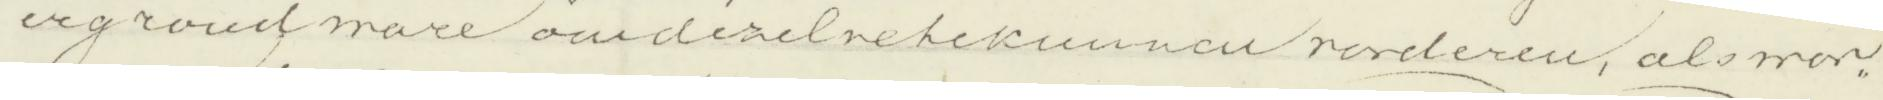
er grond ware omdezelvetekunnen vorderen, als wor„
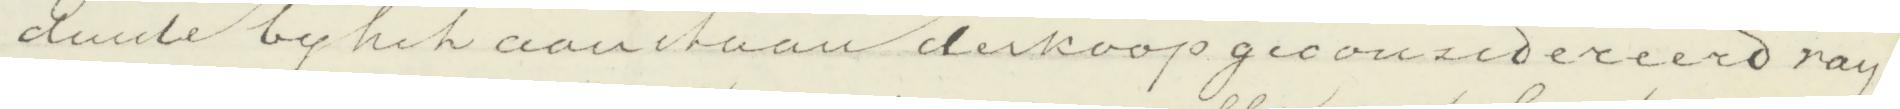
dende by het aanstaan derkoop geconsidereerd van
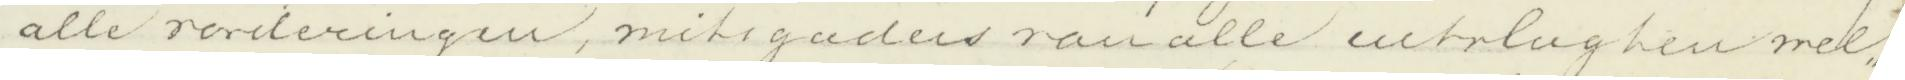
alle vorderingen, mitsgaders van alle uitvlugten wel„
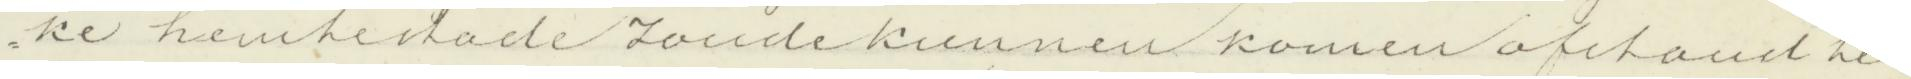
=ke hemtestade zoude kunnen komen afstand te
